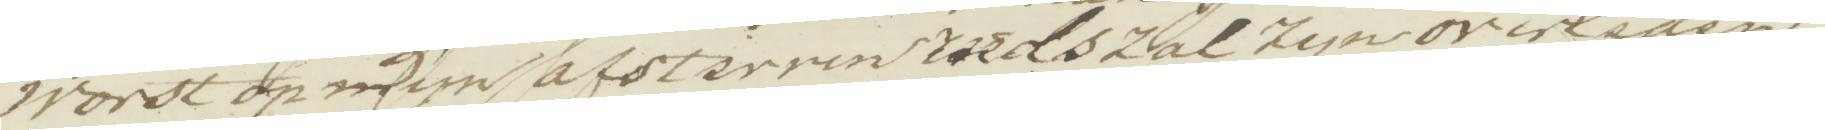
worst op mijn afsterven reeds zal zyn overleden
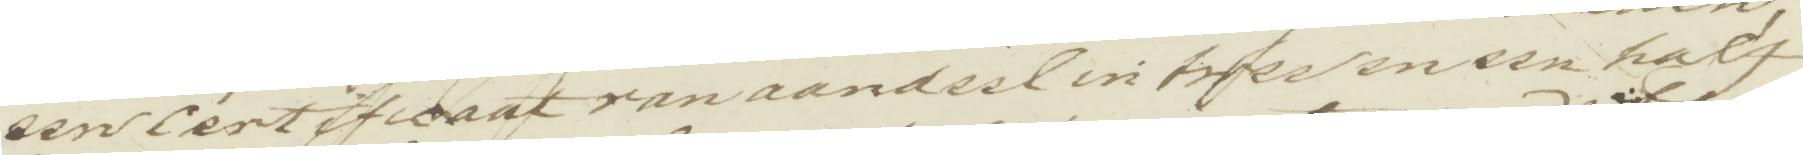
een certificaat van aandeel in twee en een half
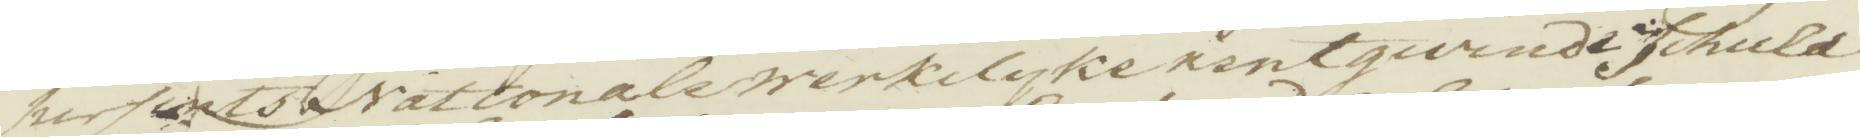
perCents Nationale werkelyke rentgevende schuld
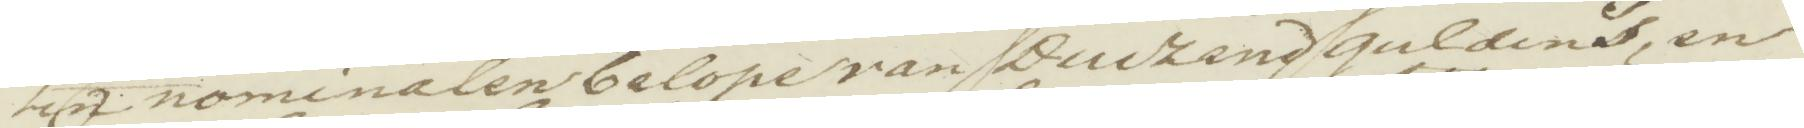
ten nominalen belope van Duizend guldens, en
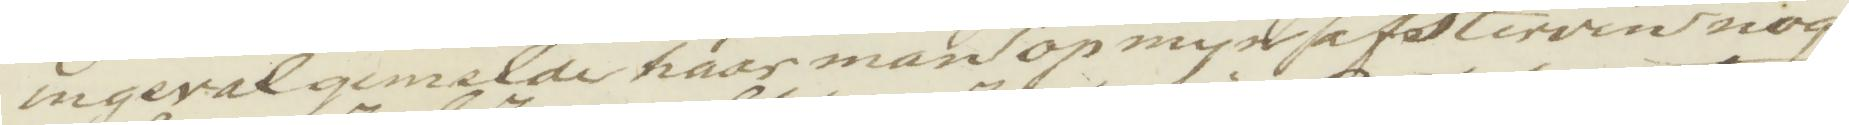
ingeval gemelde haar man op myn afsterven nog
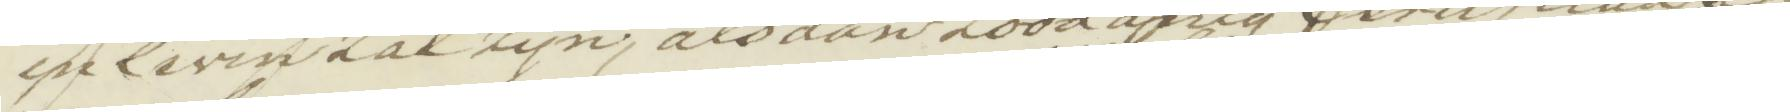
in leven zal zyn, als dan zoodanig Certificaat
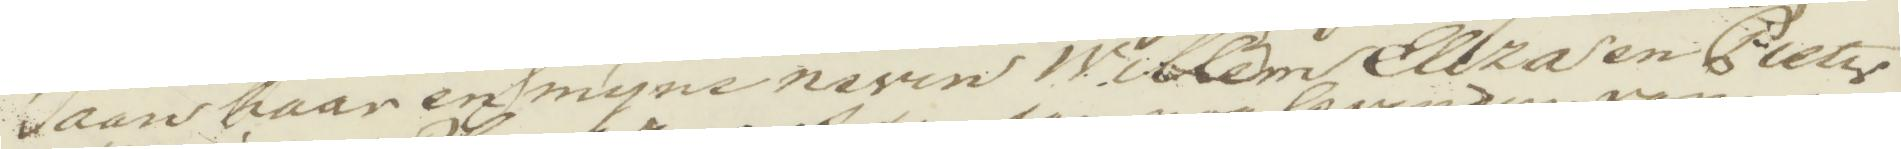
aan haar en myne neven Willem Eliza en Pieter
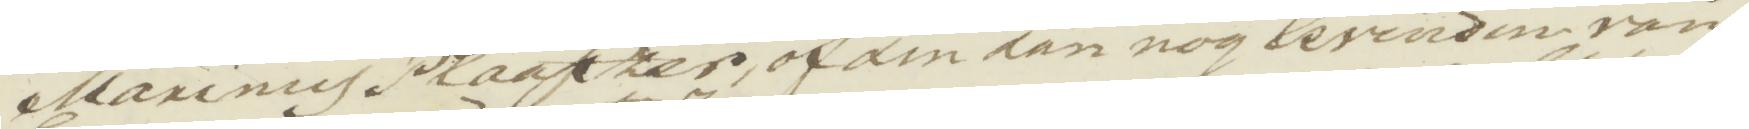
Marinus Plaatzer, of den dan nog levenden van
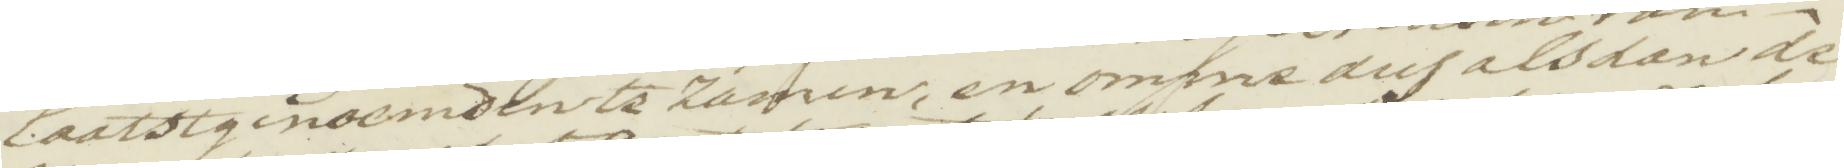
laatstgenoemden te zamen, en omme dus als dan de
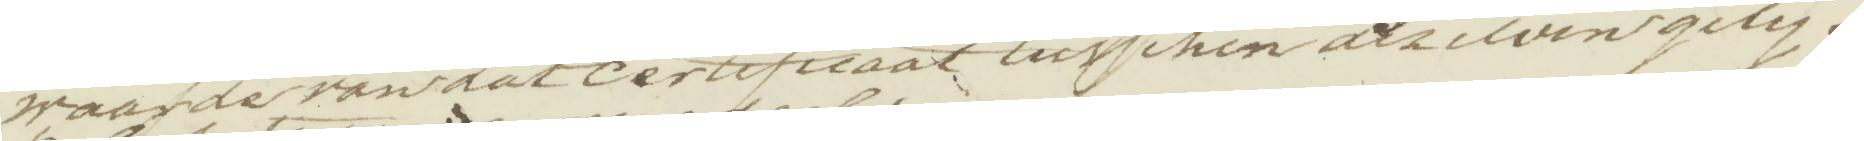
waarde van dat certificaat tusschen dezelven gely„
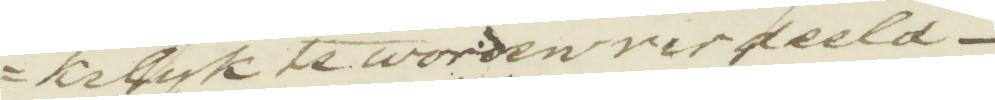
=kelyk te worden verdeeld -
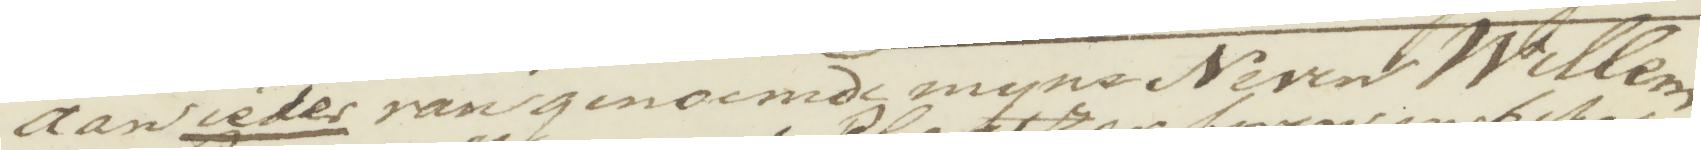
aan ieder van genoemde myne Neven Willem
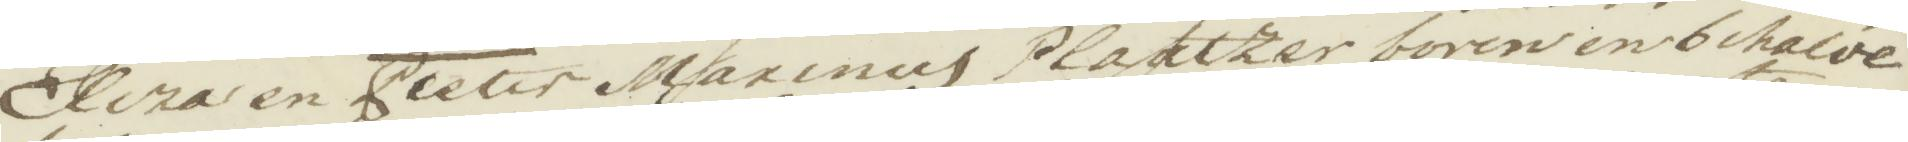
Eliza en Pieter Marinus Plaatzer boven en behalve
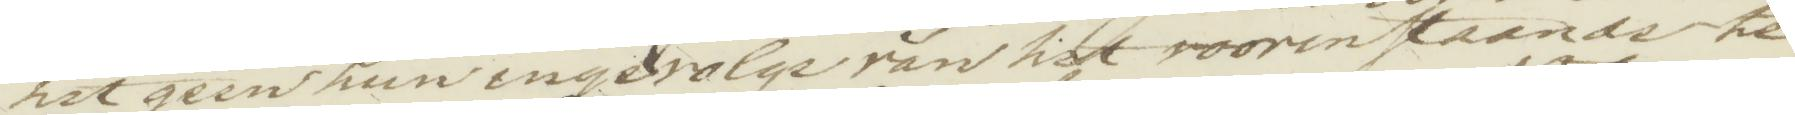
het geen hun ingevolge van het voorenstaande te
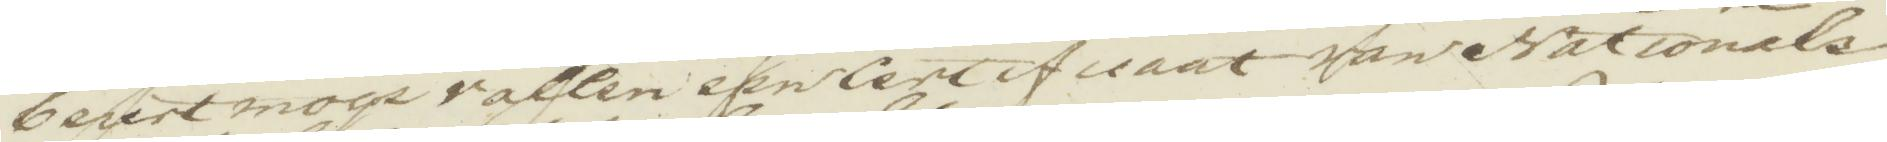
beurt moge vallen een cercificaat van Nationale
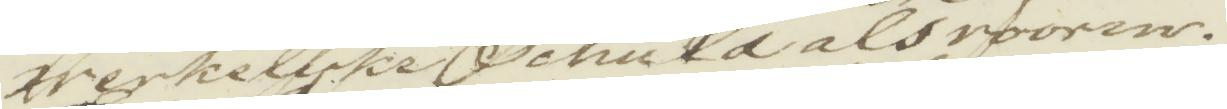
werkelyke schuld als voorm.
